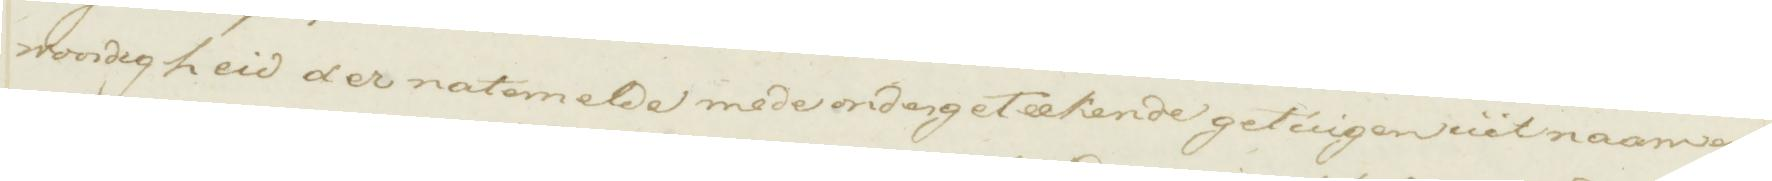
woordigheid der natemelde mede ondergeteekende getuigen uit naam en
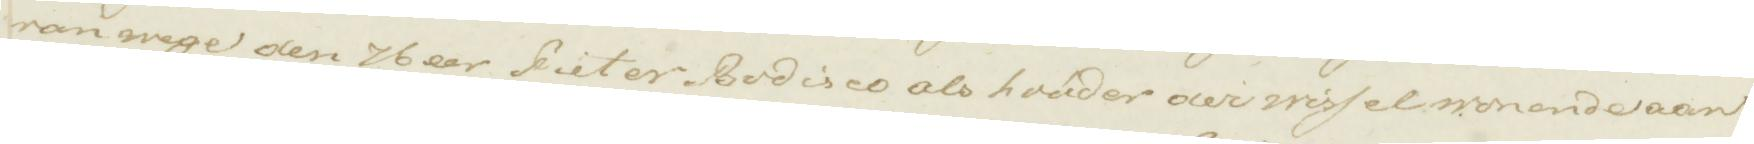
van wege den Heer Pieter Bodisco als houder der wissel wonende aan
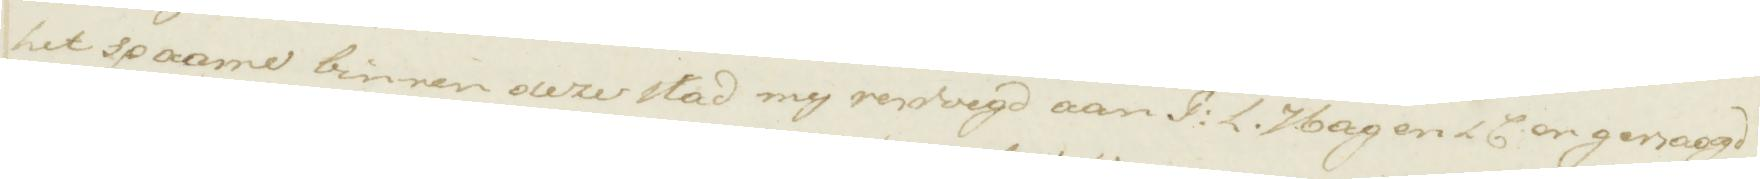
het spaarne binnen deze stad my vervoegd aan P: L. Hagen & Cor gevraagd
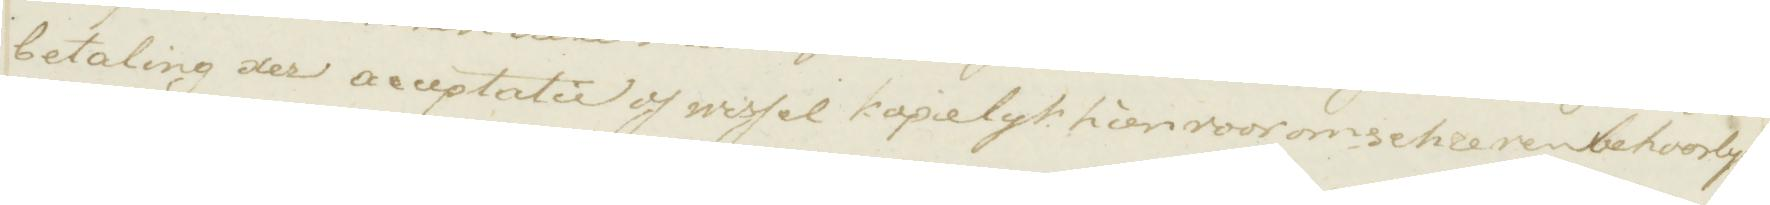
betaling der acceptatie of wissel kopielyk hier voor omschreven behoorlyk
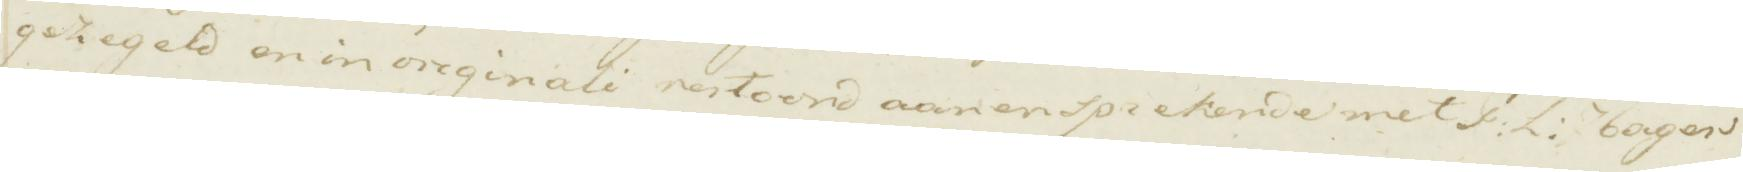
gezegeld en in originali vertoond aan en sprekende met P:L: Hagen
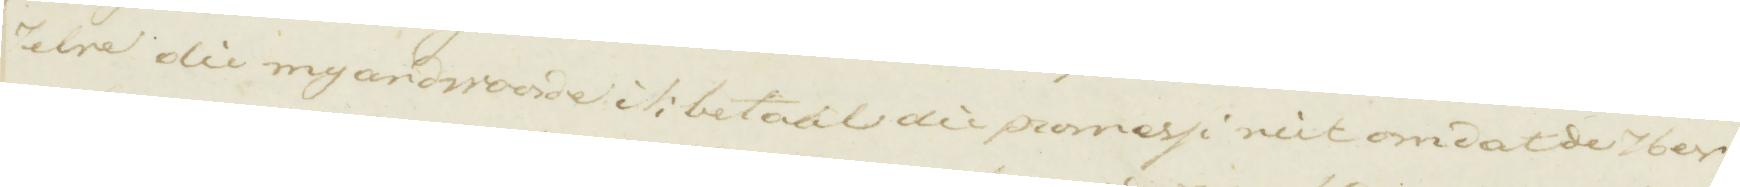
zelve die my andwoorde ik betaale die provessi niet omdat de Her
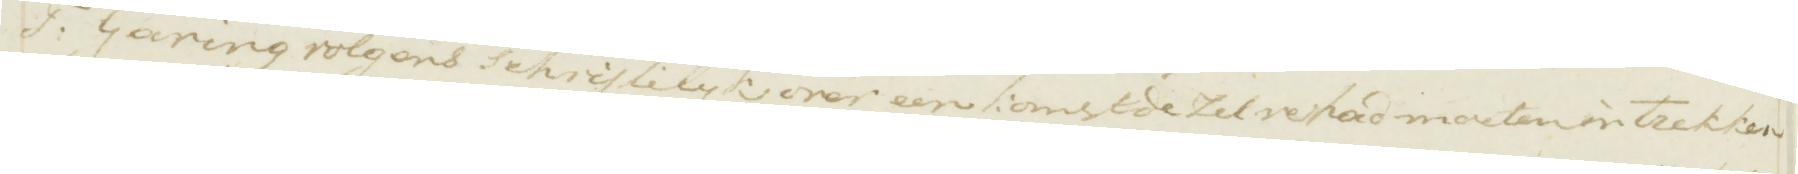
T: Garing volgens schriftelyk overeenkomst dezelve had moeten in trekken
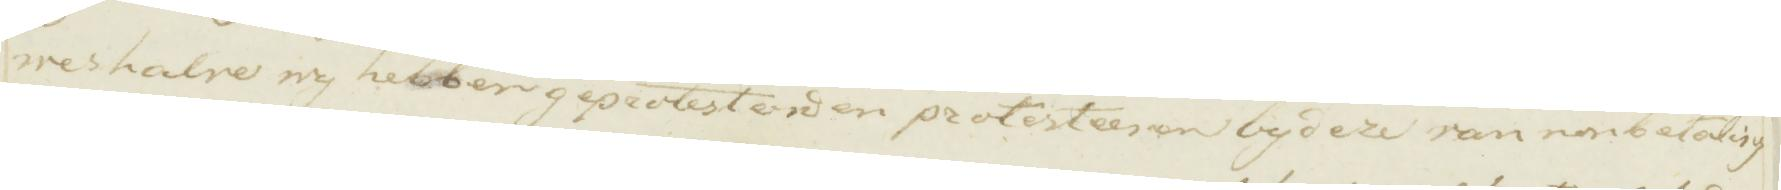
wezhalve wy hebben geprotesteerd en protesteeren by deze van non belating
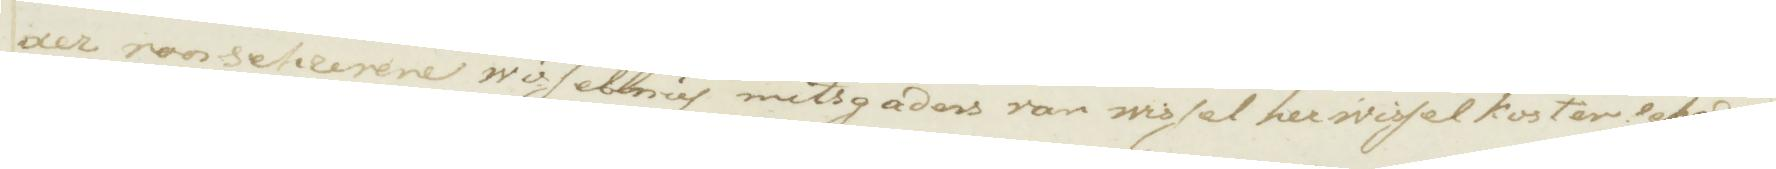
der voorscheevene wisselbrief mitsgaders van wissel herwissel kosten ter schaden
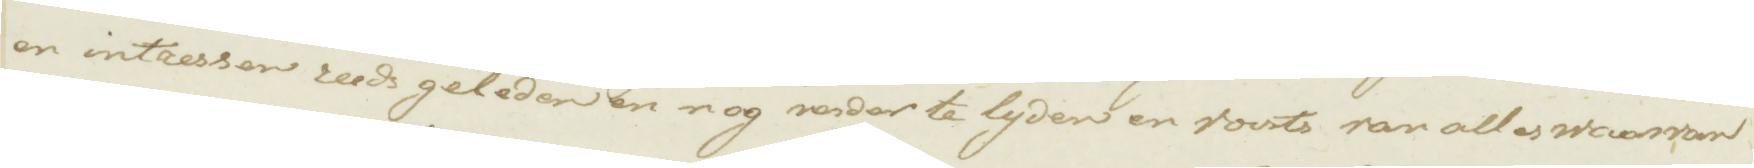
en intressen reeds geleden en nog verder te lyden en voorts van alles waarvan
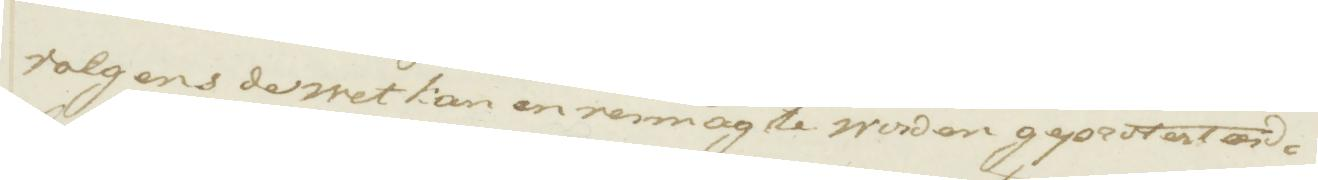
volgens de wet kan en vermag te worden geprotesteerd.
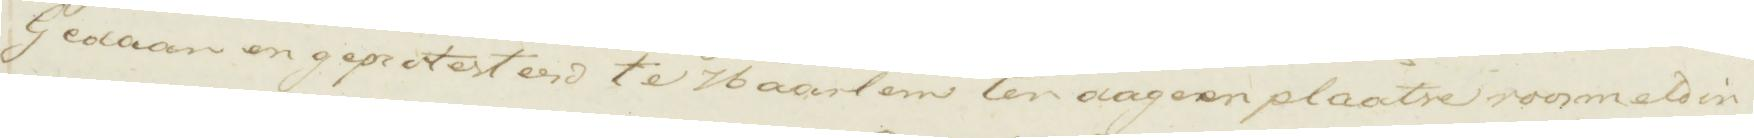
Gedaan en geprotesteerd te Haarlem ter dage en plaatse voormeld in
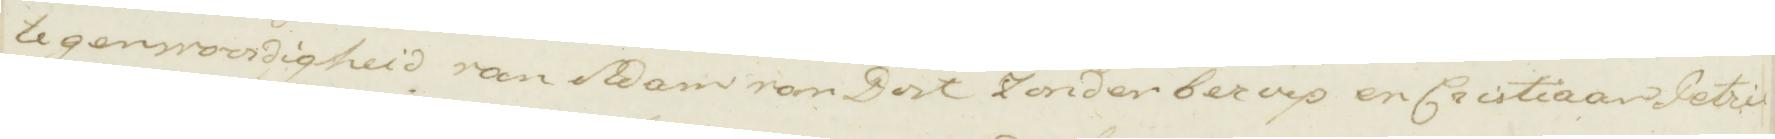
tegenwoordigheid van Adam van Dort zonder beroep en Cristian Petrie
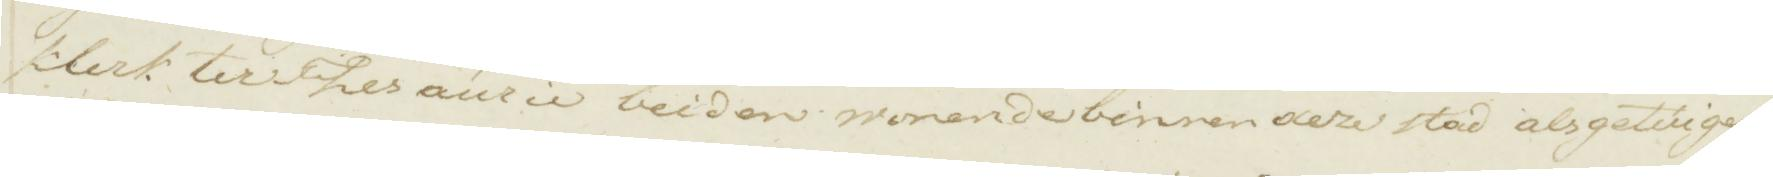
klerk ter Thesaurie beiden wonende binnen deze stad als getuigen
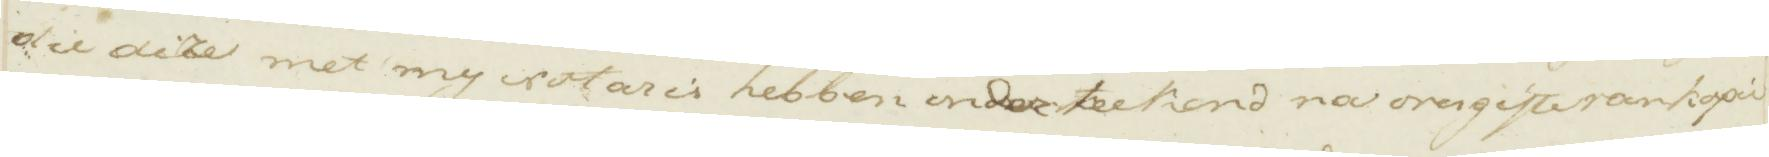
die deze met my Notaris hebben onderteekend na overgift van kopie
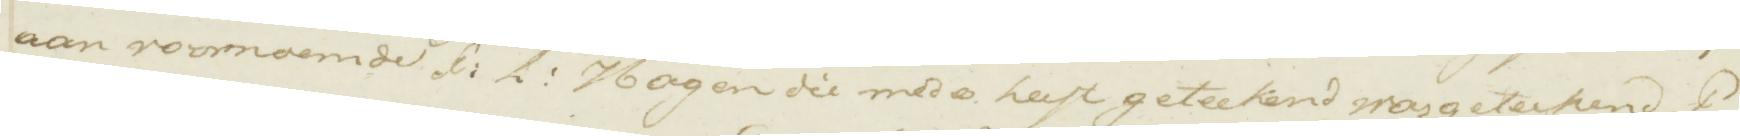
aan voornoemde P: L: Hagen die mede heeft geteekend was geteekend
